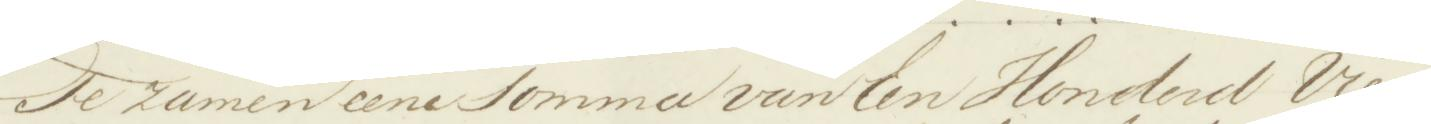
Te zamen eene somma van Een Honderd Vier
